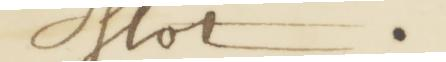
'T slot.
